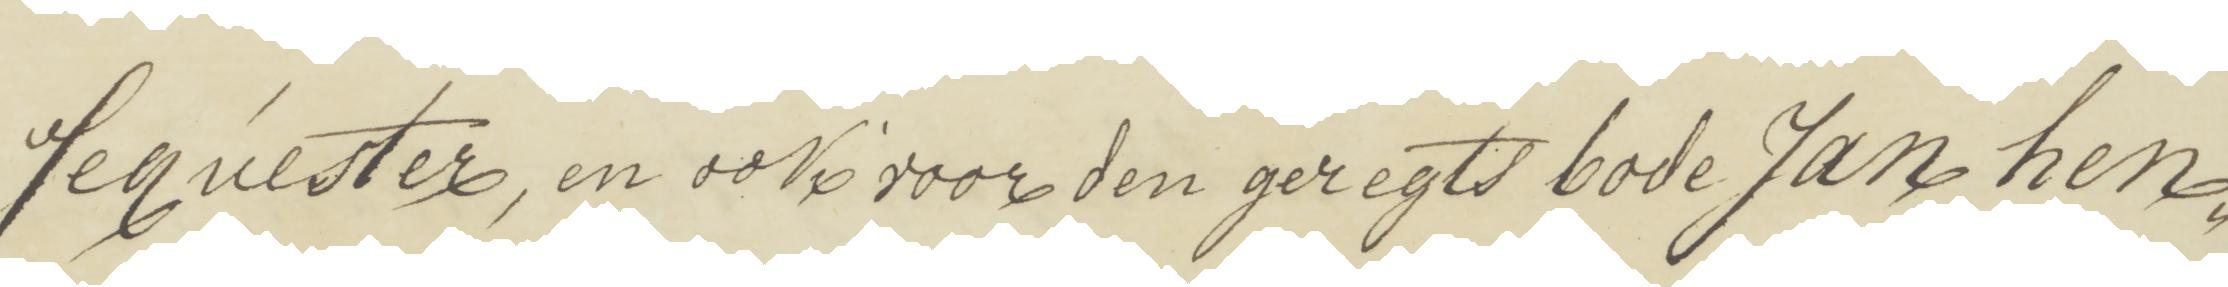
sequester, en ook voor den geregts bode Jan hen„
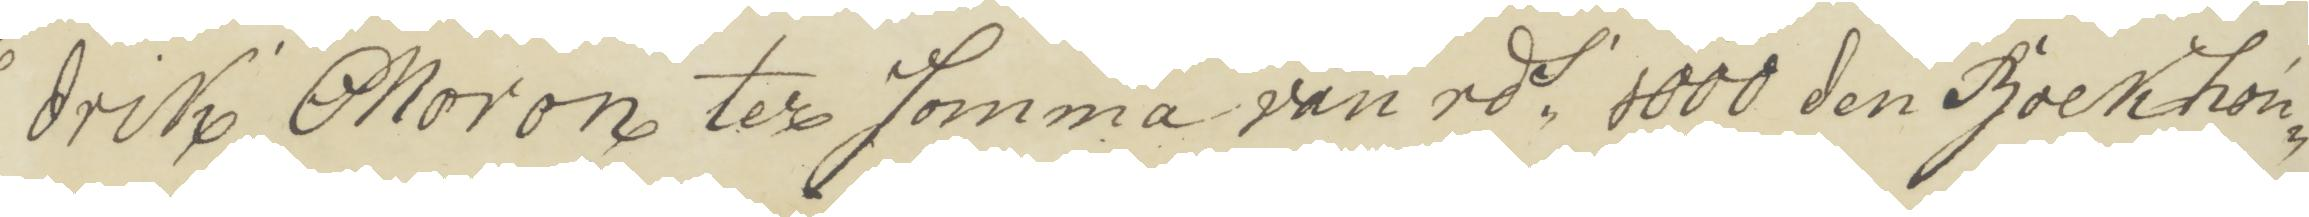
drik Moron ter somma van rd„s 1000 den Boekhou„
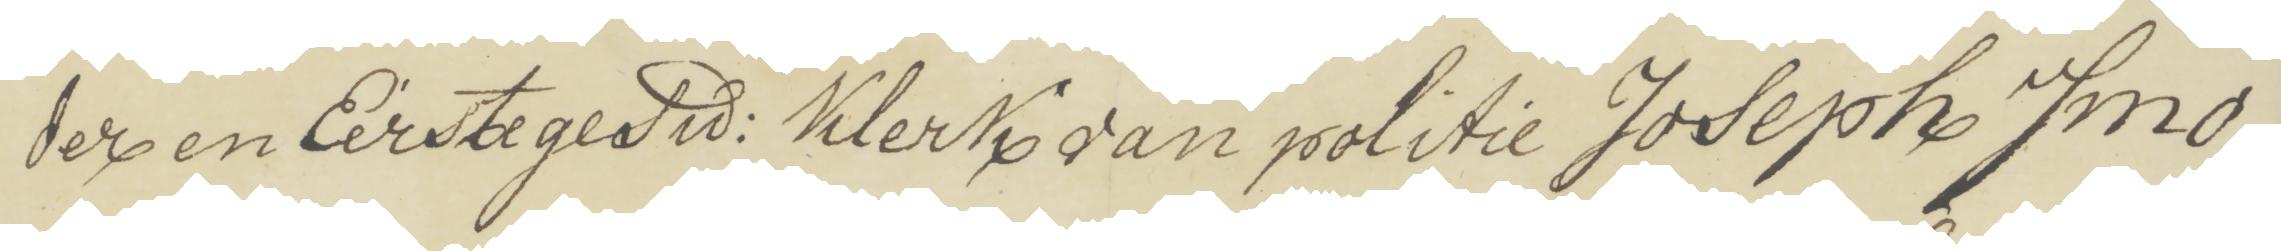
der en Eerste gesid: klerk van politie Joseph smo
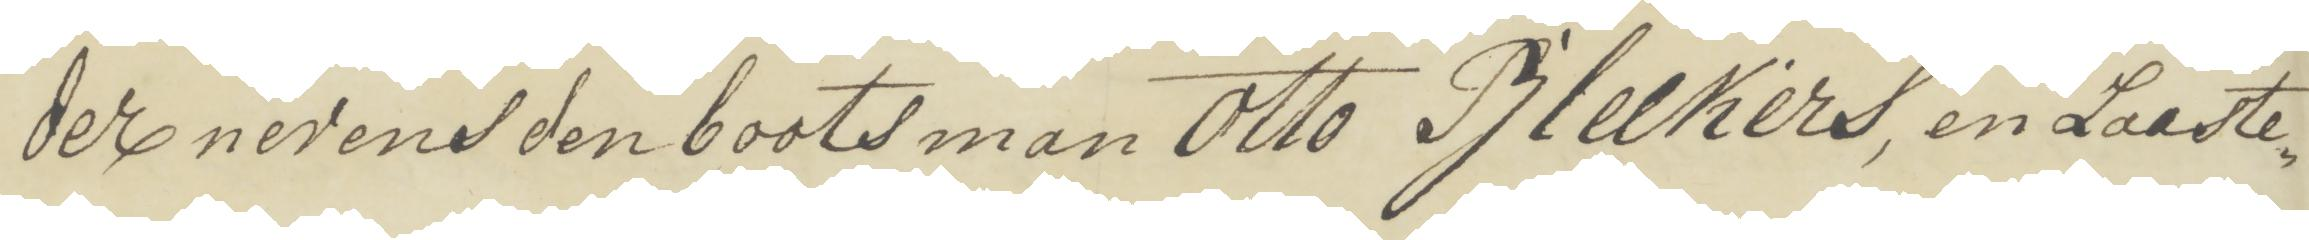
der nevens den bootsman Otto Bleekers, en Laaste„
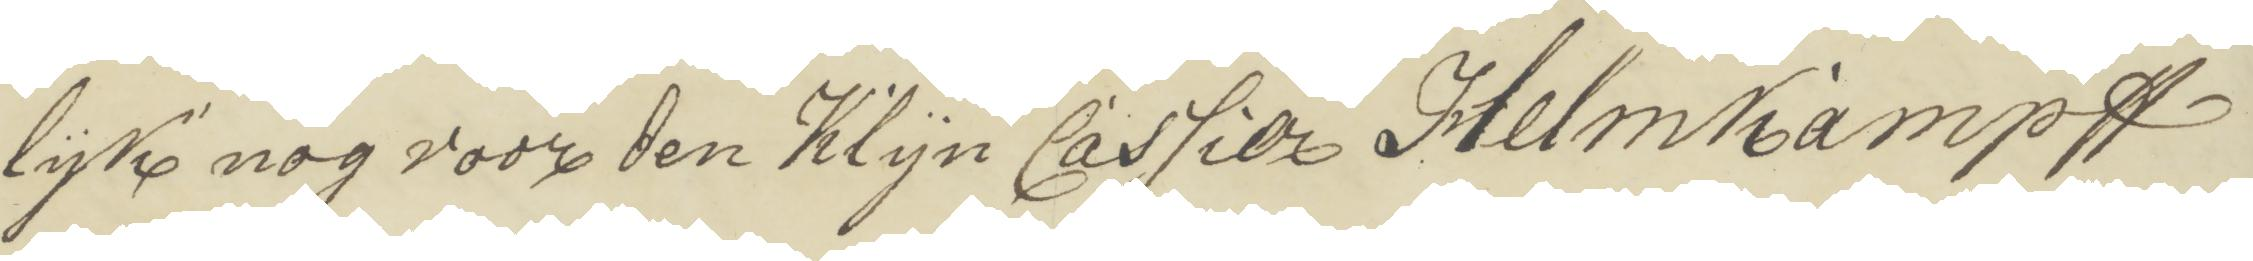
lijk nog voor den klijn Cassier Helmkampff
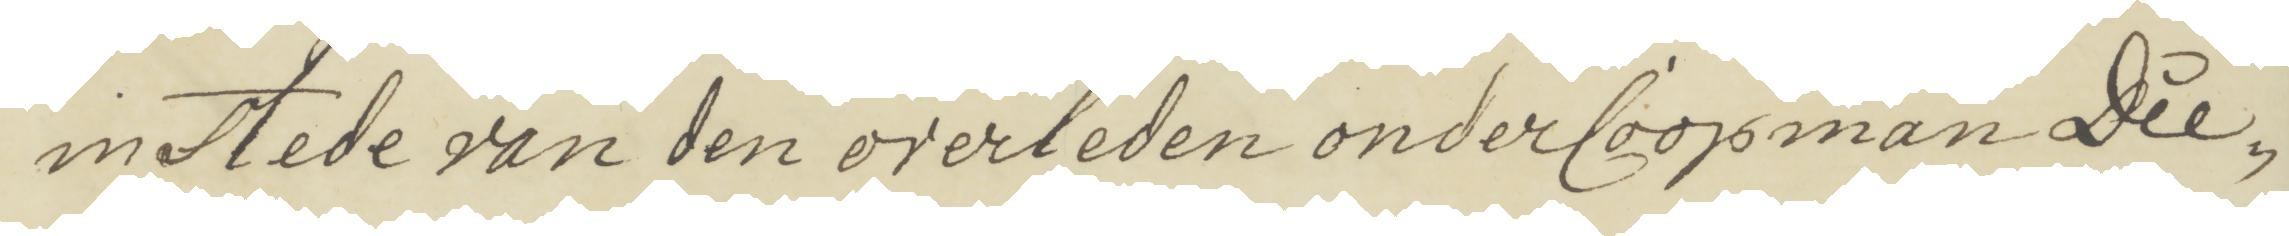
instede van den overleden onderCoopman Del„
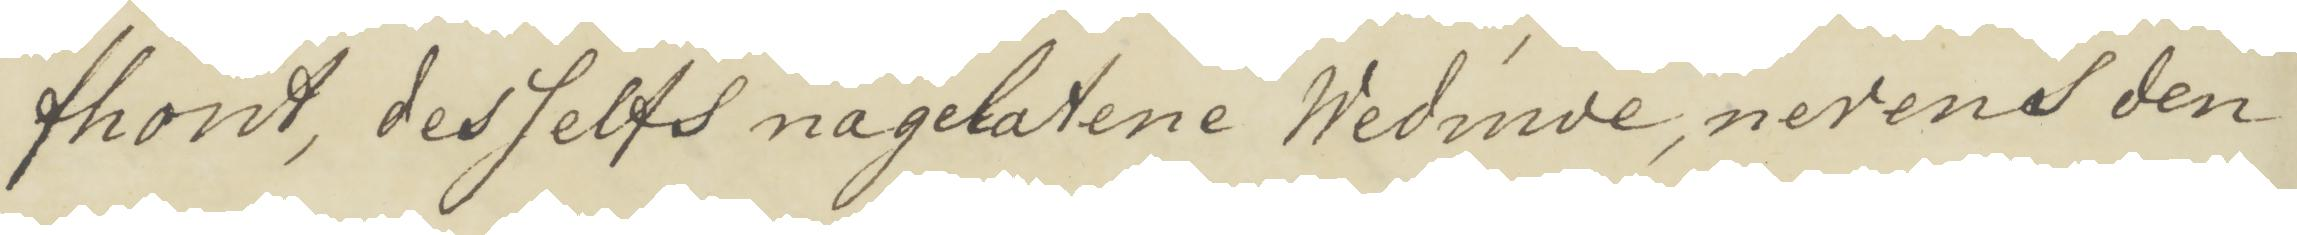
fhout, desselfs nagelatene weduwe, nevens den
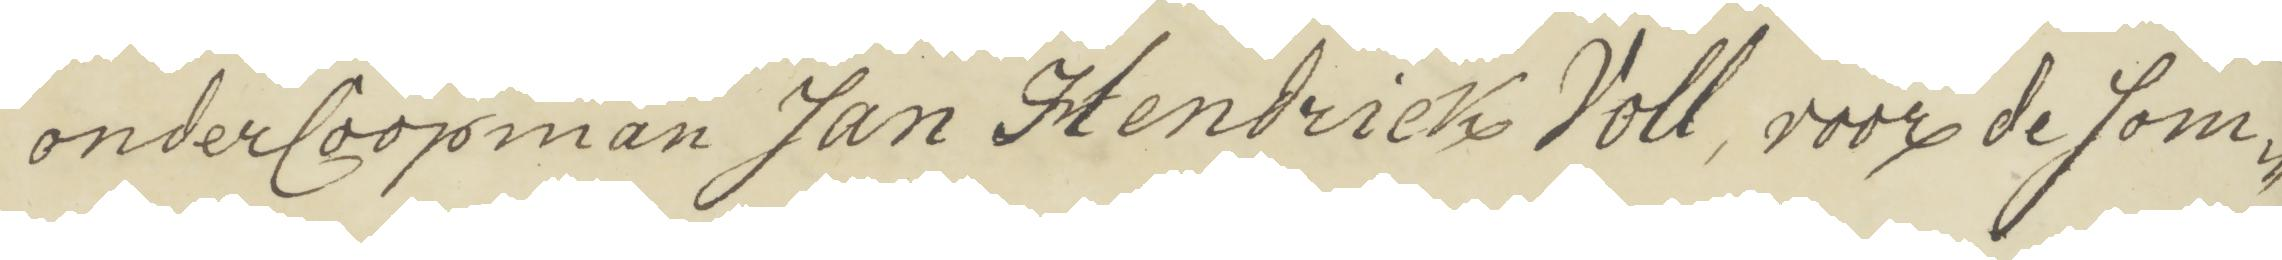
onderCoopman Jan Hendrick Voll, voor de som„
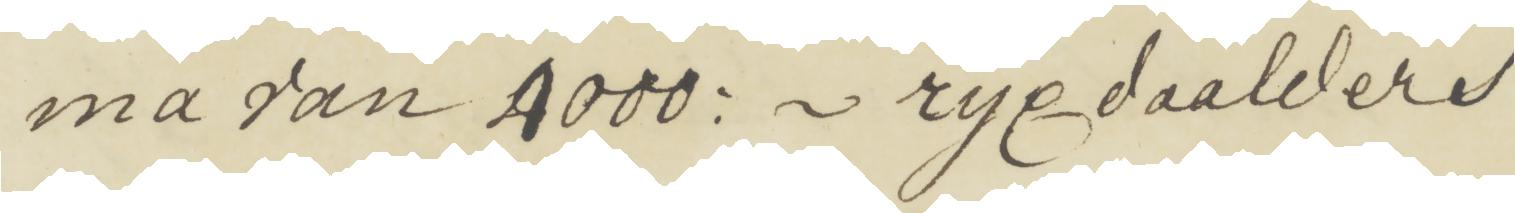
ma van 4000: ~ rijxdaalders
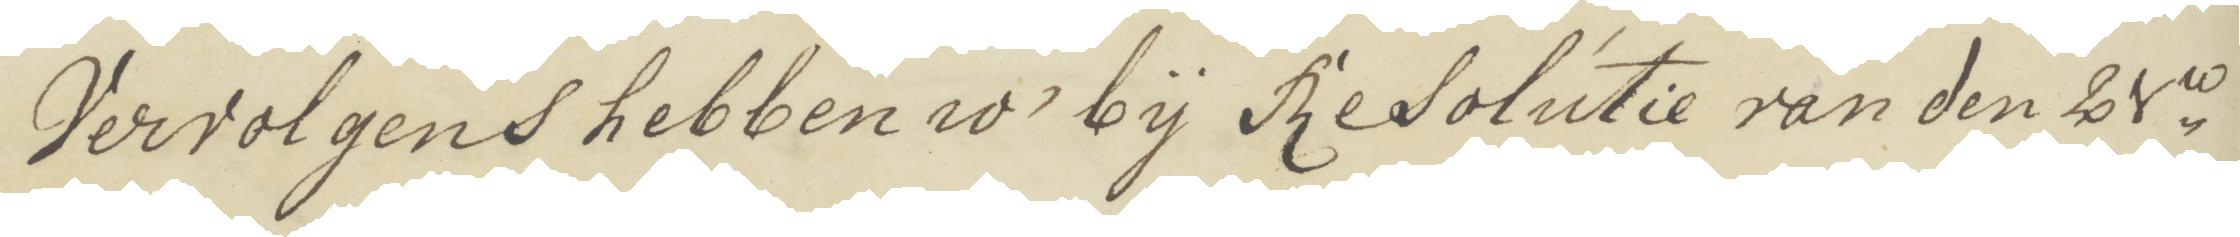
Vervolgens hebben w' bij Resolutie van den 21„n
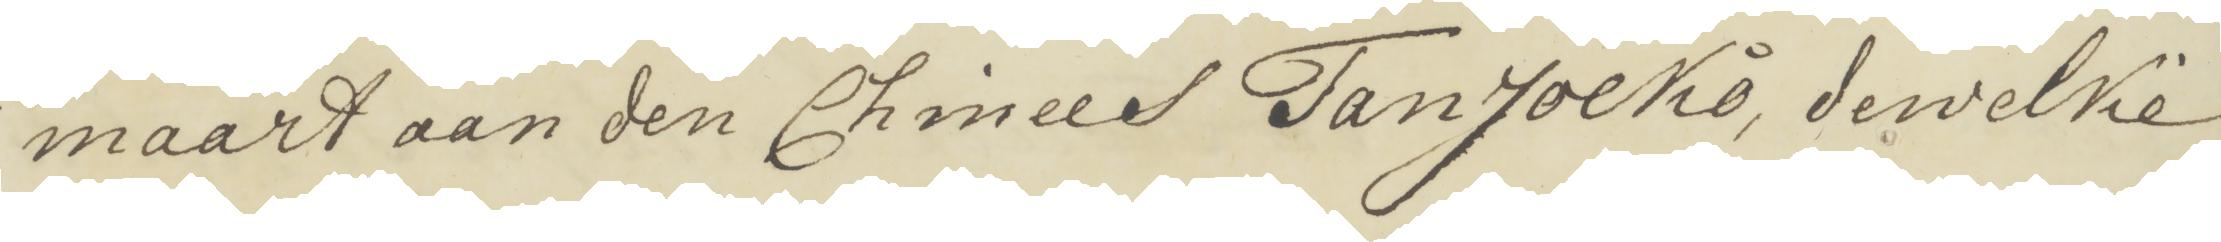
maart aan den Chinees Tanjoeko, dewelke
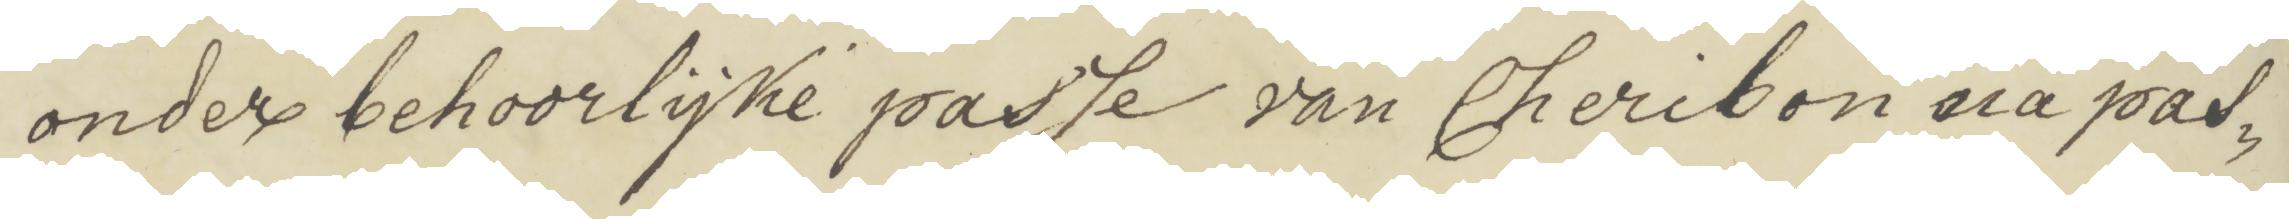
onder behoorlijke passe van Cheribon na pas„
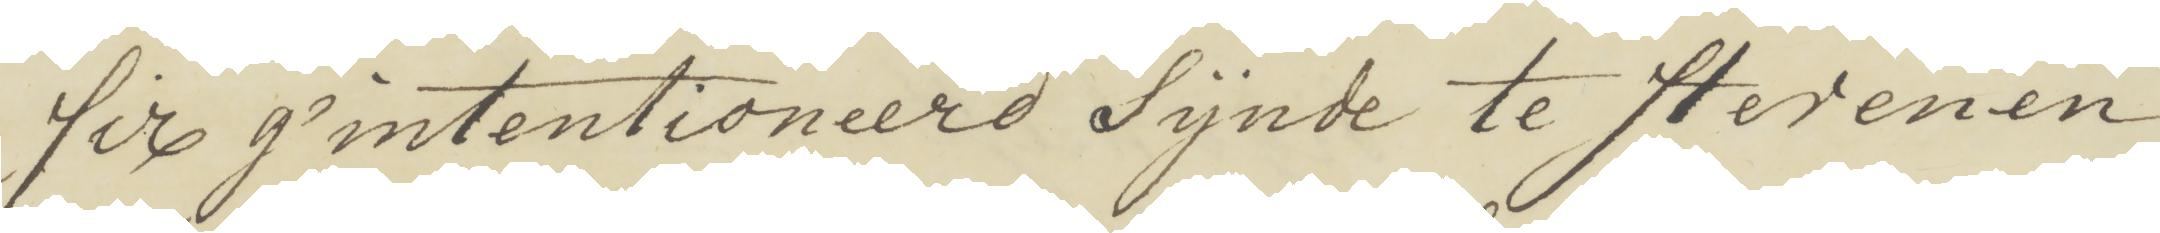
sir g’intentioneerd sijnde te stevenen,
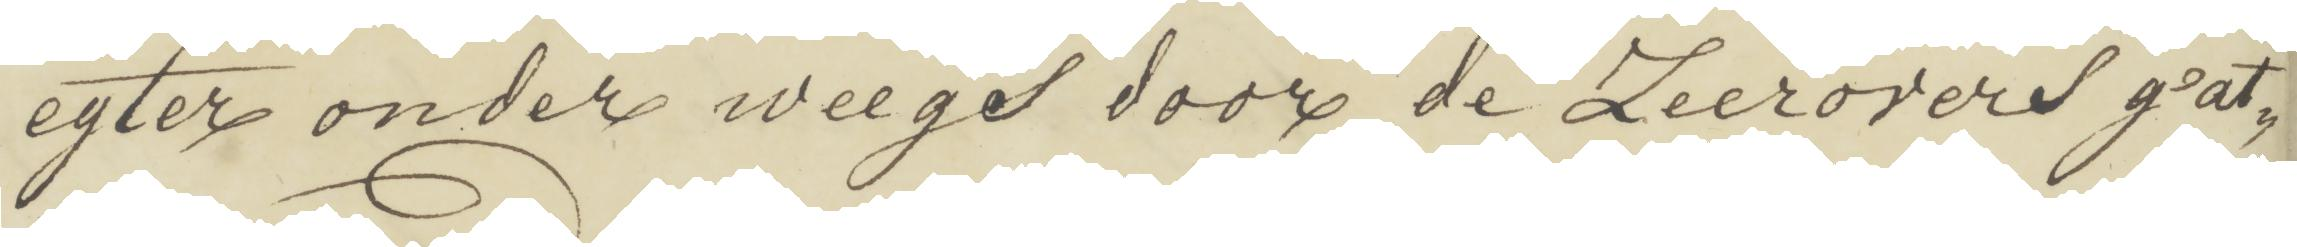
egter onder weegs door de zeerovers g’at„
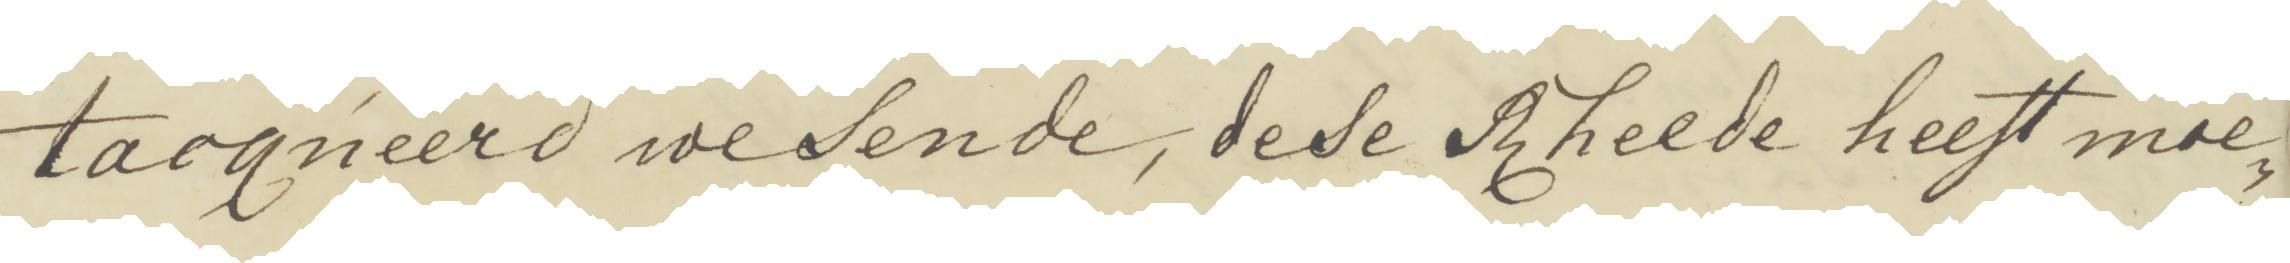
tacqueerd wesende, dese Rheede heeft moe„
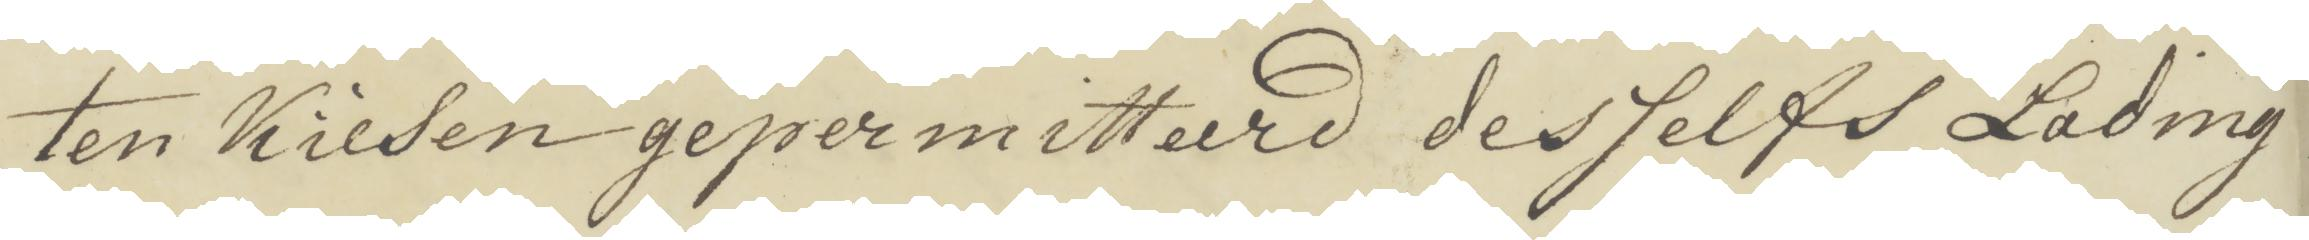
ten Kiesen gepermitteerd desselfs Lading
